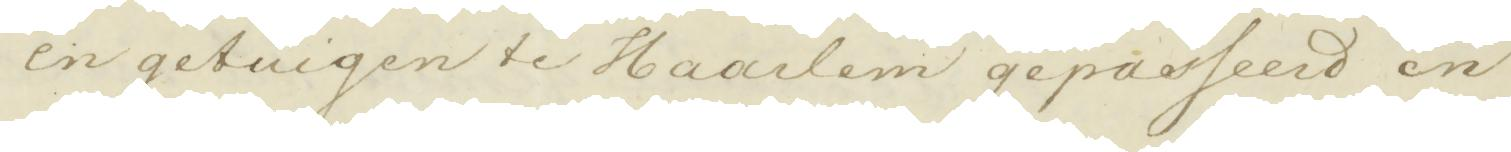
en getuigen te Haarlem gepasseerd en
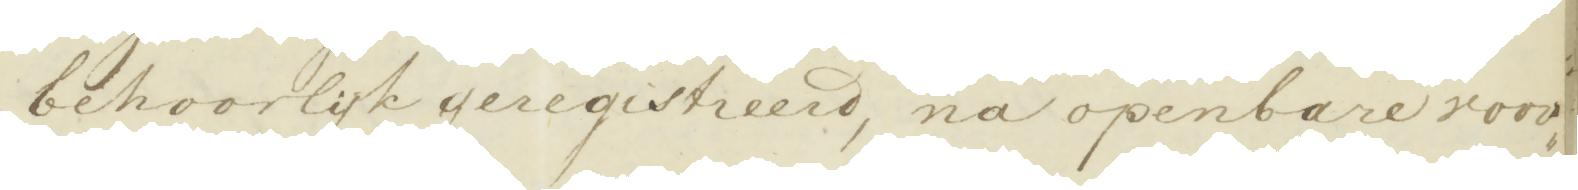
behoorlijk geregistreerd, na openbare voor„
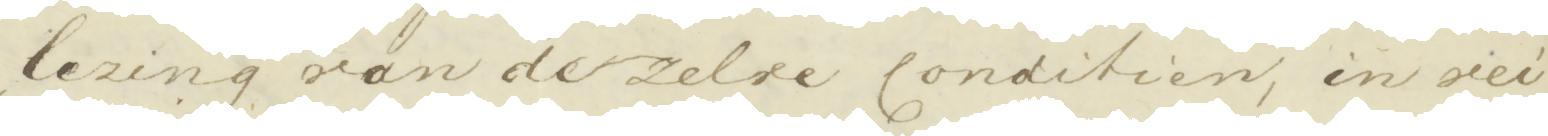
lezing van dezelve conditien, in vei
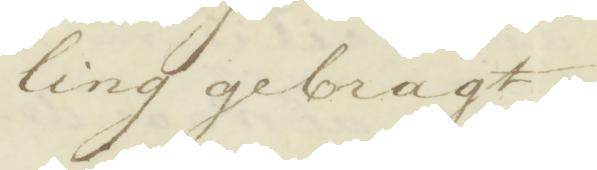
ling gebragt :
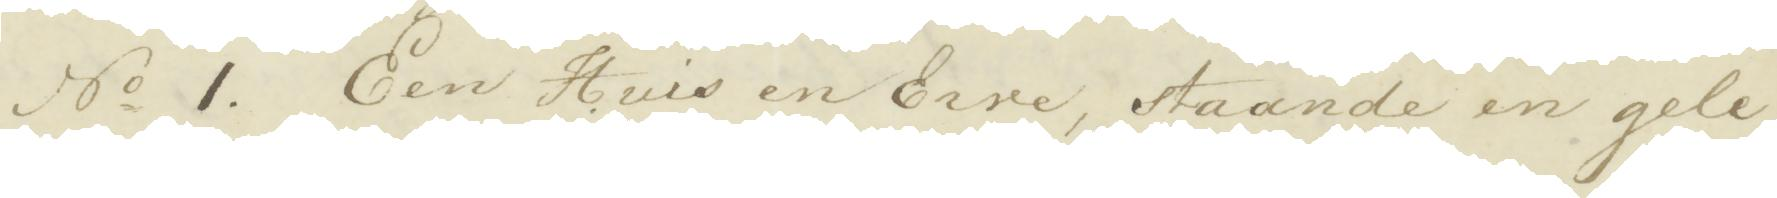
N=o 1. Een Huis en Erve, staande en gele
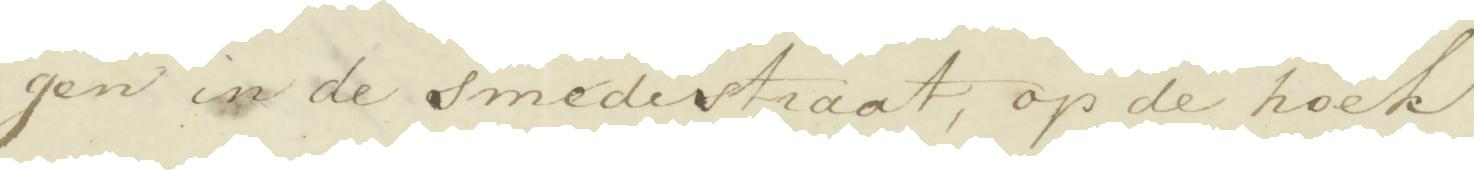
gen in de smedestraat, op de hoek
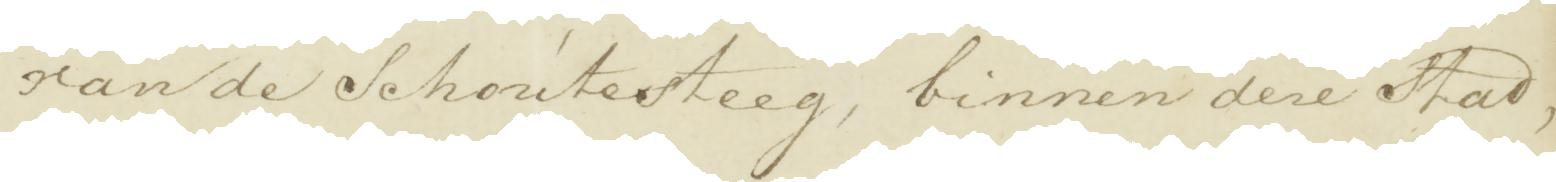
van de schoutesteeg, binnen deze stad
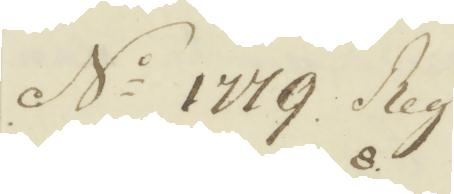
N:o 1770. Reg
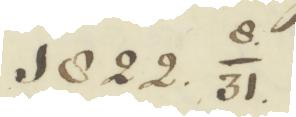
1822. 8/31.
